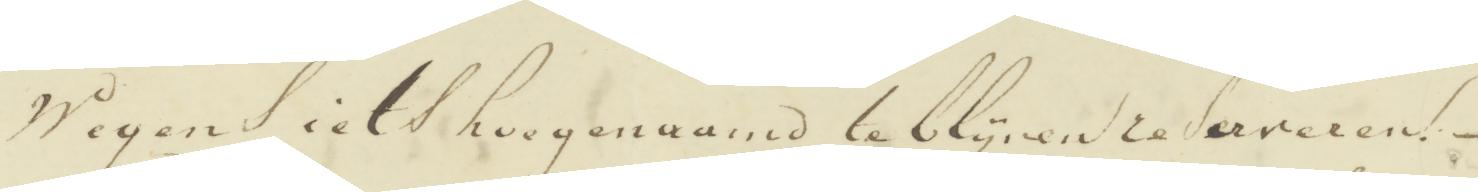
Wegens iets hoegenaamd te blijven reserveren.
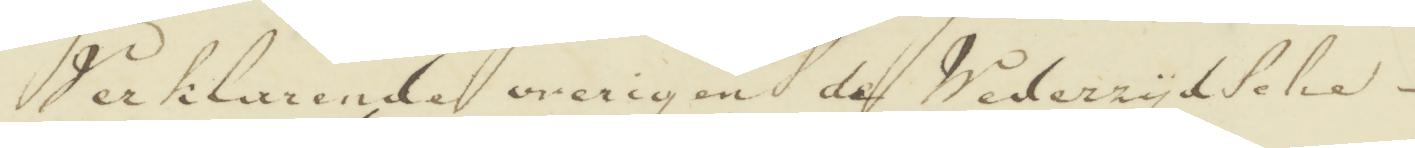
Verklarende overigens de Wederzijdsche
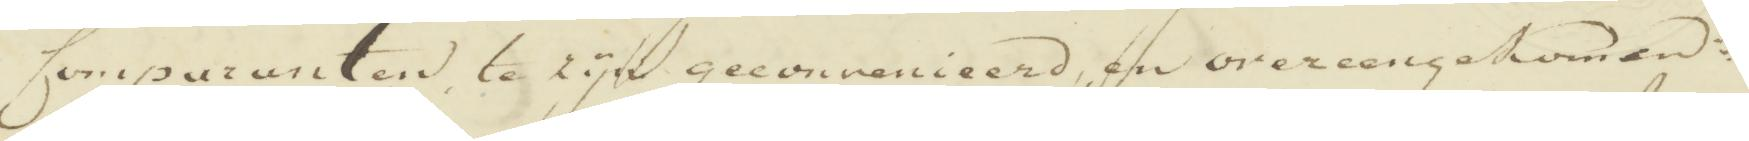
Comparanten, te zijn geconvenieerd, en overeengekomen:
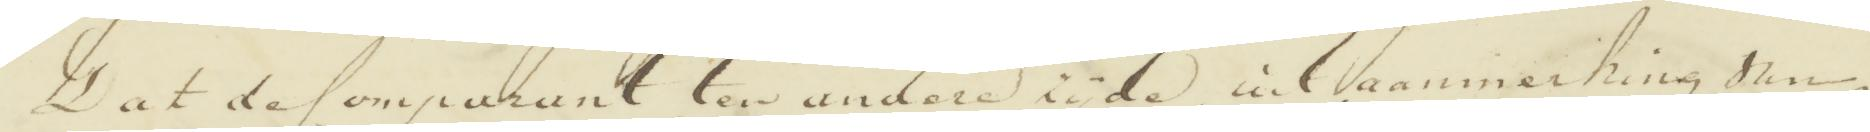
Dat de Comparant ten andere zijde, uit aanmerking van
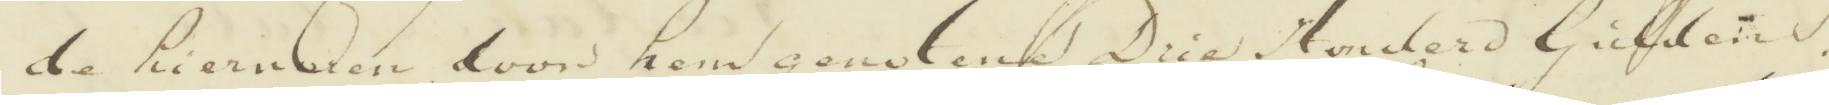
de hiervoren door hem genotende Drie Honderd Guldens
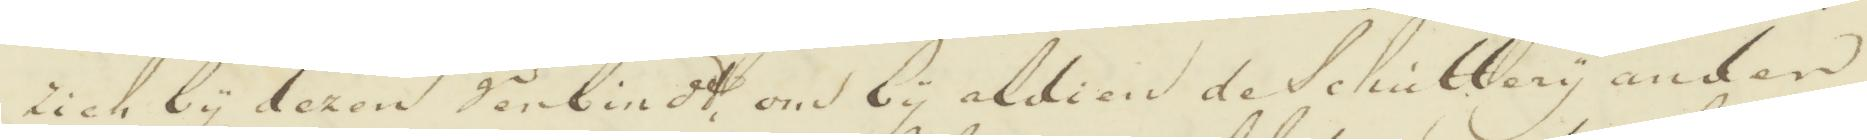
zich bij dezen verbindt, om bij aldien de schutterij ander,
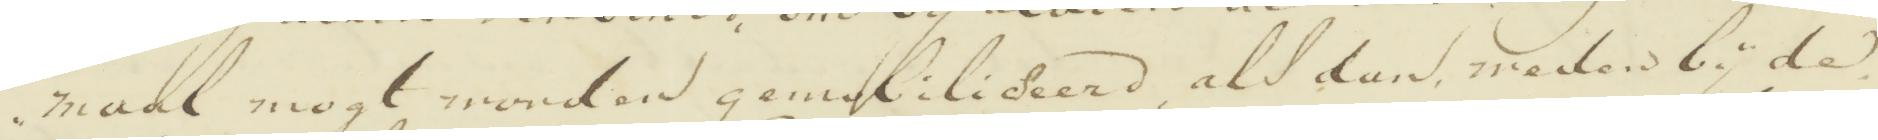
„maal mogt worden gemobiliseerd, als dan, weder bij de
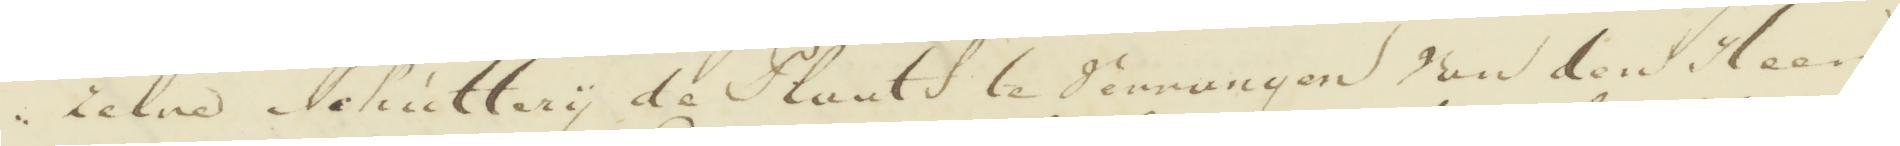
„zelve schutterij de Plaats te vervangen van den Heer
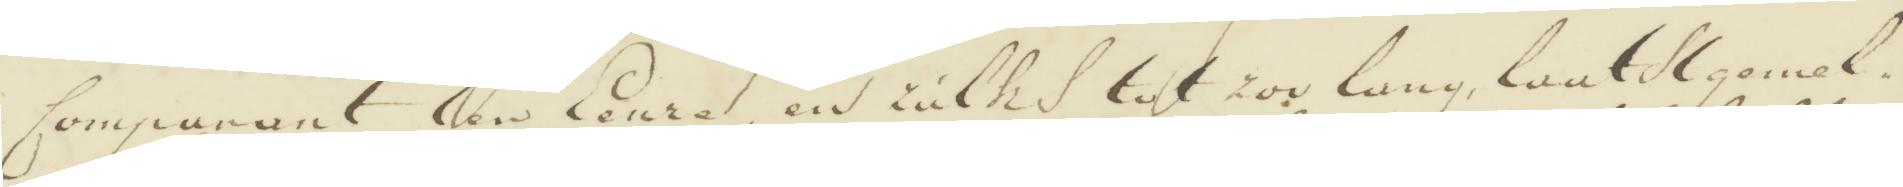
Comparant ten Eenre, en zulks tot zoo lang, laatstgemel„
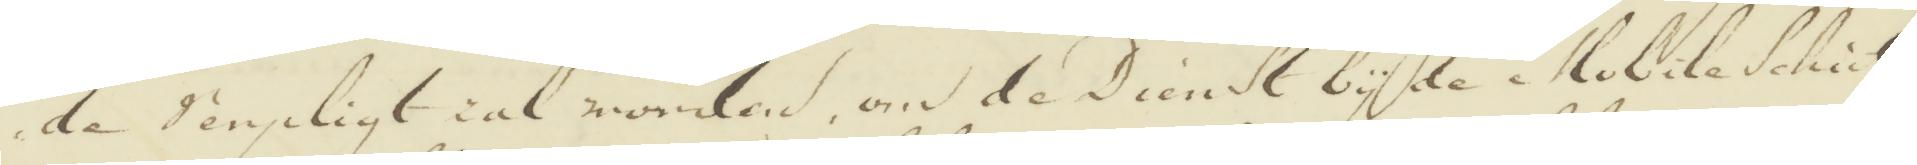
„de verpligt zal worden, om de Dienst bij de Mobile schut
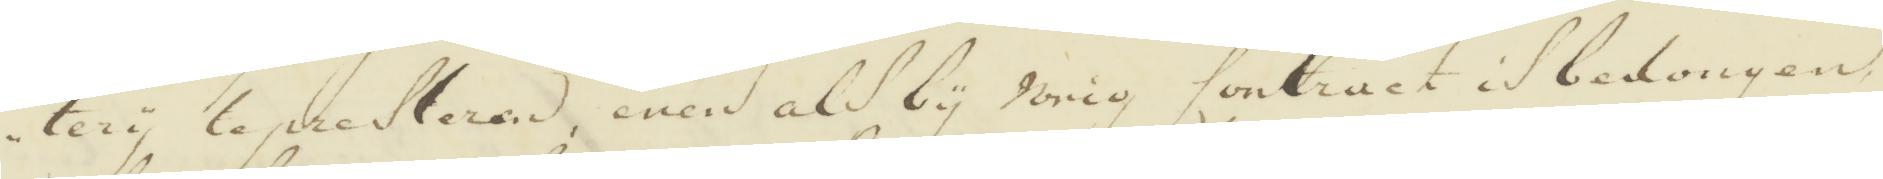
„terij, te presteren, even als bij vorig Contract is bedongen,
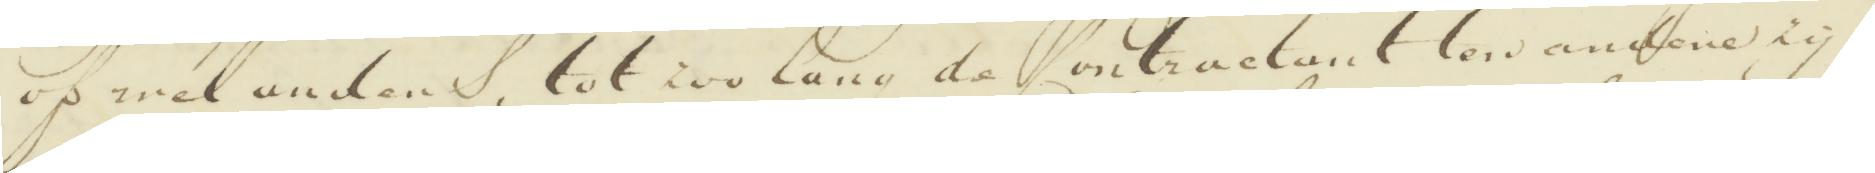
of wel anders, tot zoo lang de Contractant ten andere zij
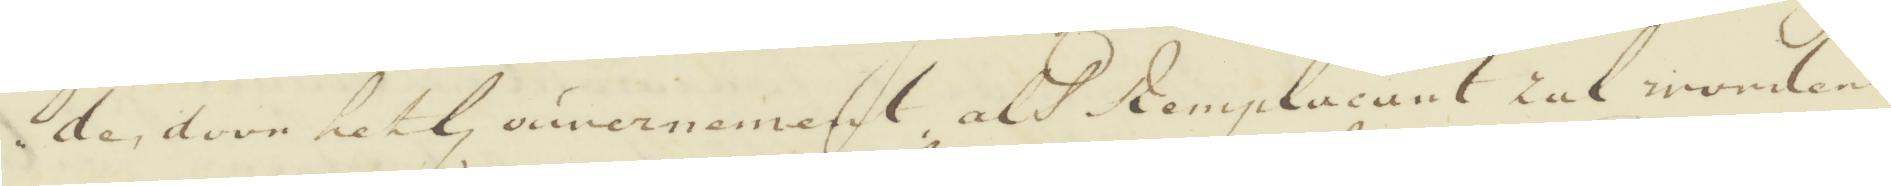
„de, door het Gouvernement als Remplacant zal wonder
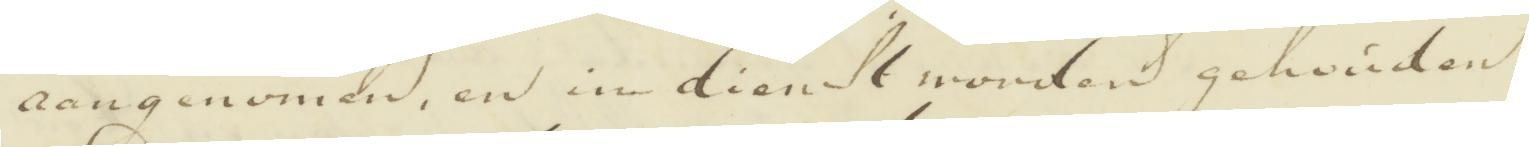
aangenomen, en in dienst worden gehouden
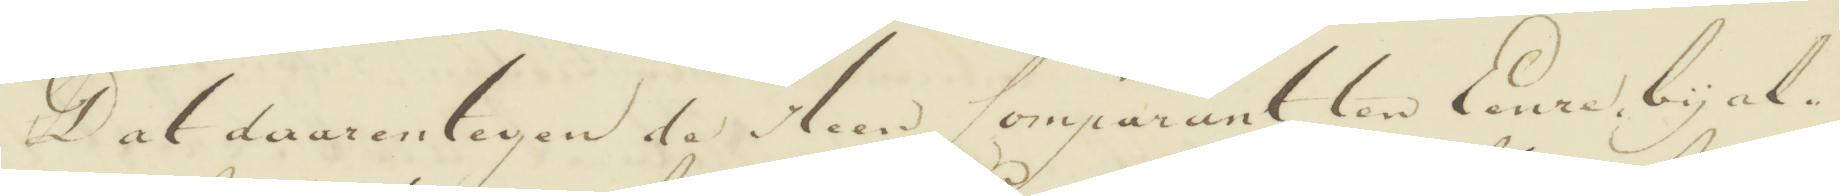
Dat daarentegen den Heer Comparant ten Eenre bij al„
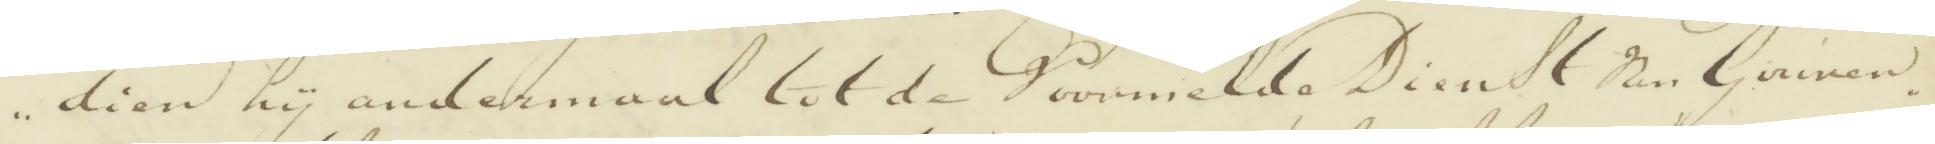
„dien hij andermaal tot de Voormelde Dienst van Gouver„
